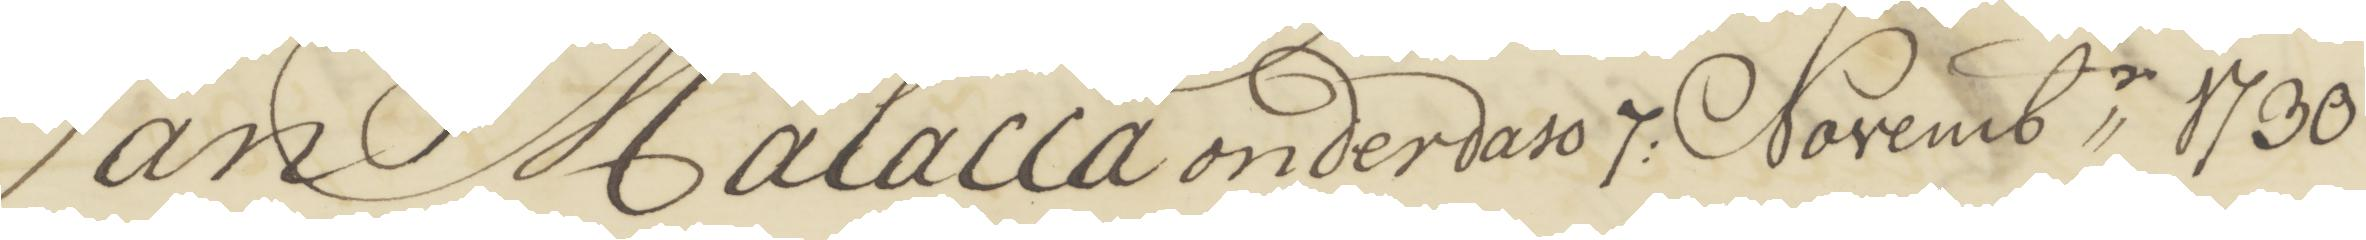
Van Malacca onderdato 7: Novemb„r 1730
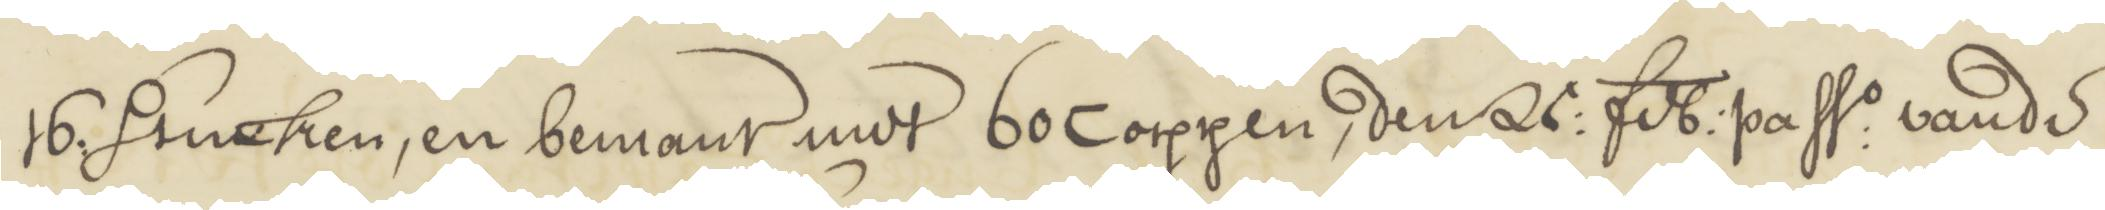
16. stucken, en bemant met 60 coppen, den 25: feb: pass:o van de
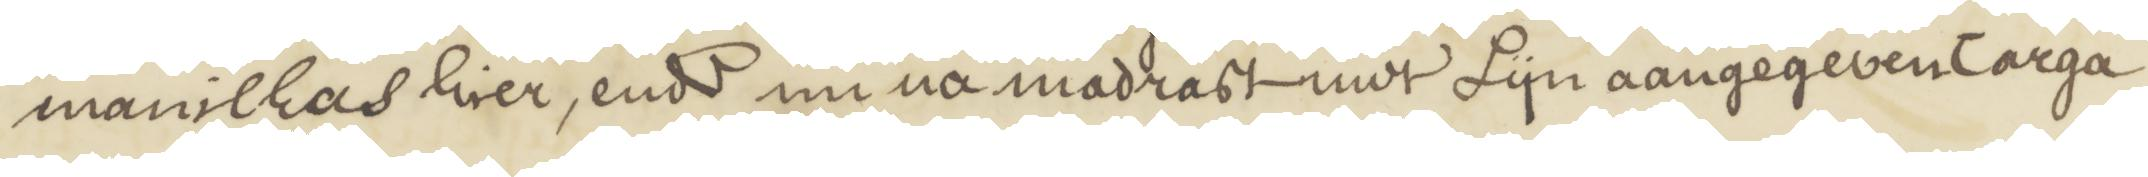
manilhas hier, ende nu na madrast met sijn aangegeven carga
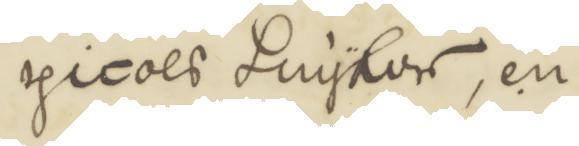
700 picols suijker, en
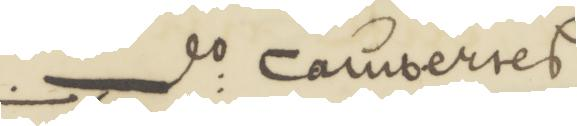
600. _:o cauwertes
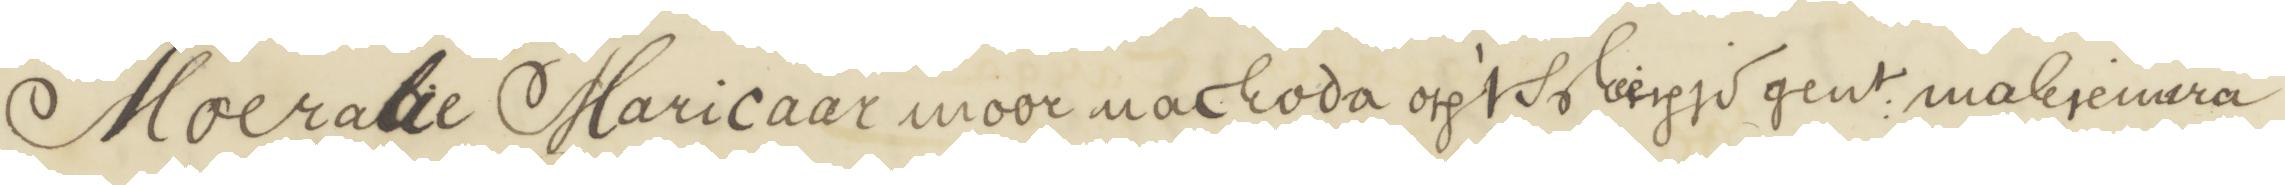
den 7: maart Moeralie Maricaar moor nachoda op’t 's scheepje gen:t mahjemira
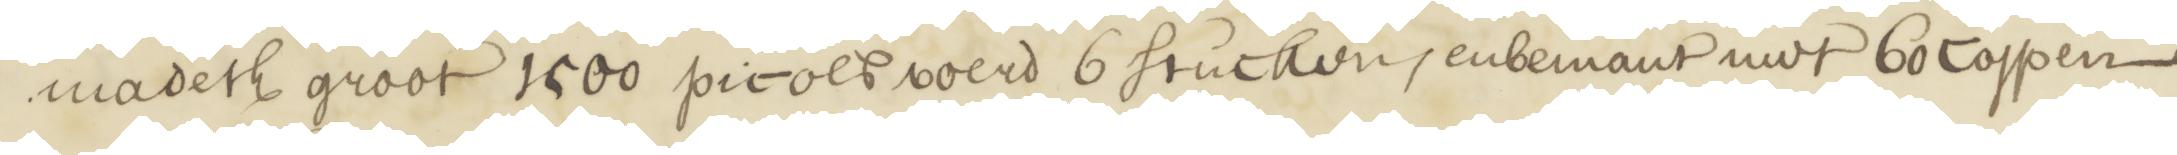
madeth groot 1500 picols voerd 6 stucken, en bemant met 60 coppen
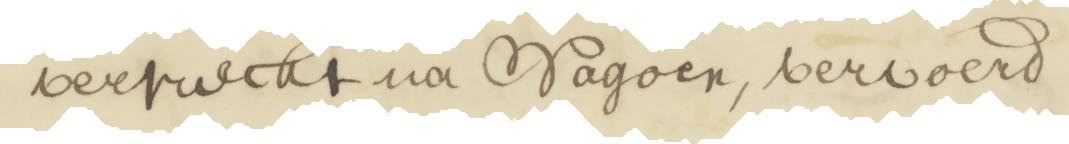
vertreckt na Nagoer, vervoerd
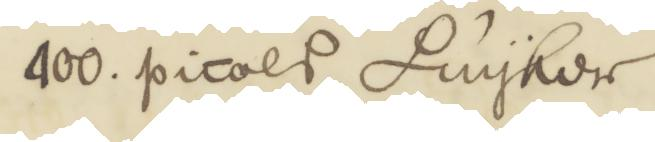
400. picols suijker
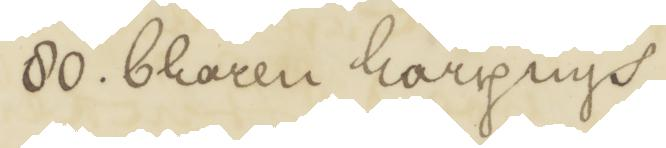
80. bharen harpuijs
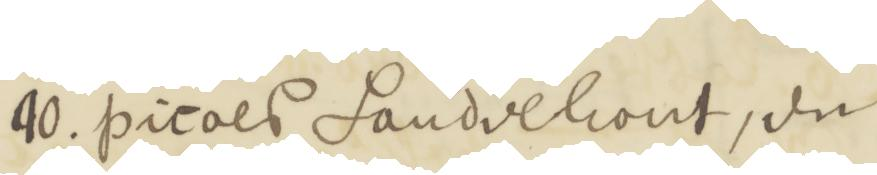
40. picols sandelhout, en
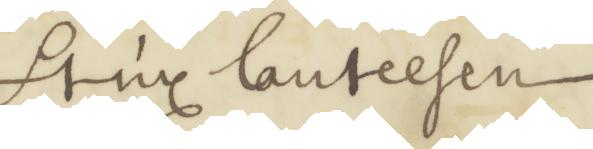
16000 stux lanteesen
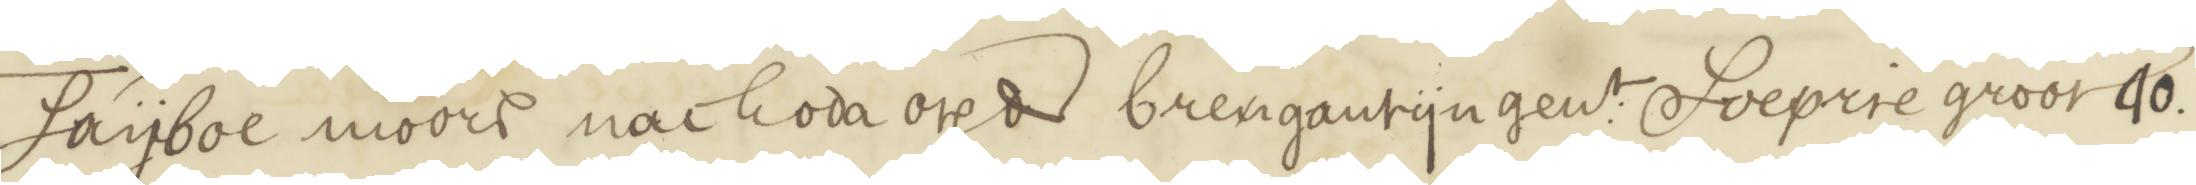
7 _:o saijboe moors nachoda op de brengantijn gen:t Soeprie groot 40.
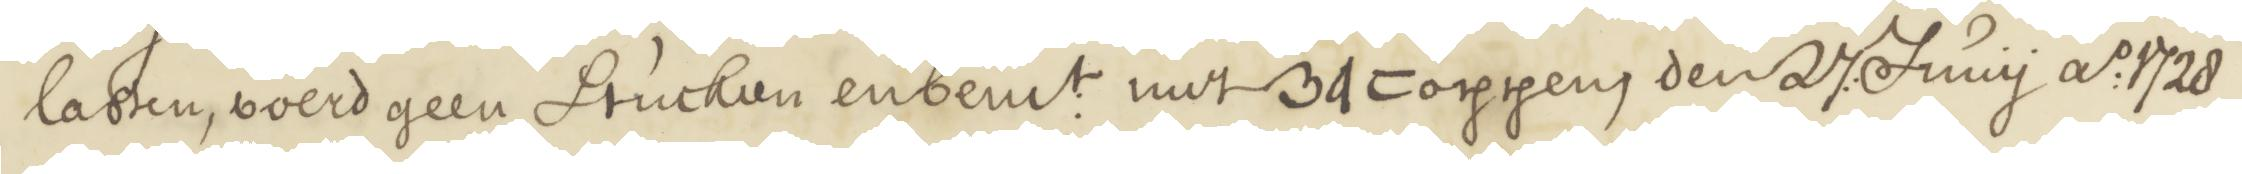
lasten, voerd geen stucken en bem:t met 34 coppen, den 27: Junij a:o 1728
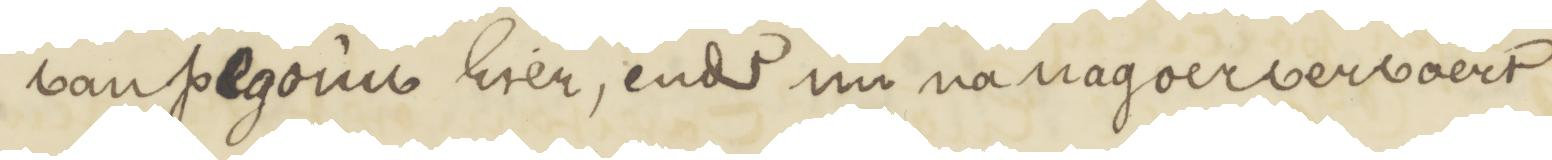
van plgouw hier, ende nu na nagoer vervoert
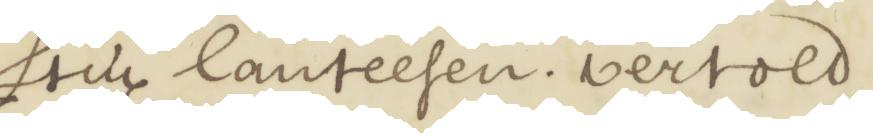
20000. stux lanteesen. vertold
